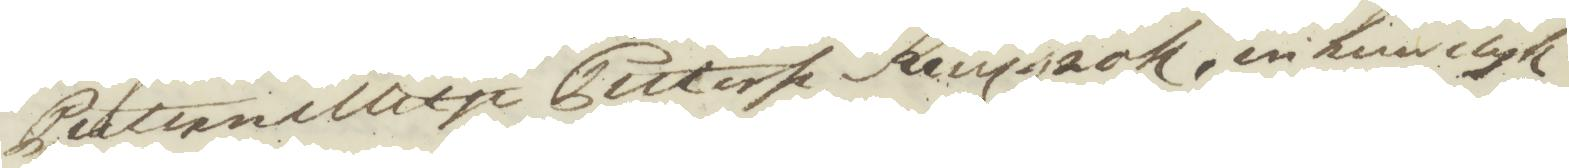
Pieternelletje Pieterse Ruygrok, in huwelyk
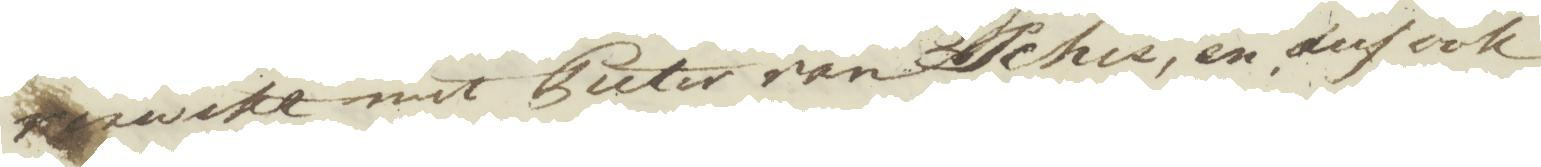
verwekt met Pieter van Schie, en dus ook
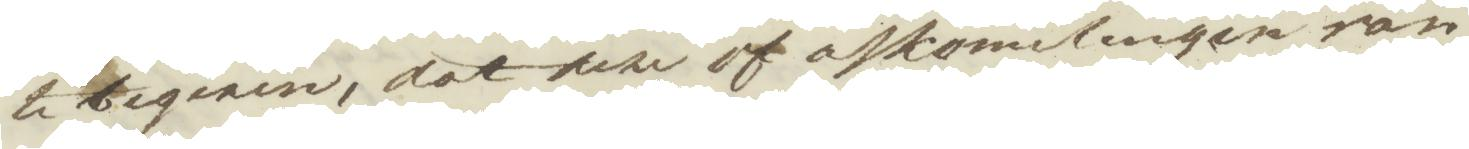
te begeren, dat deze of afkomelingen van
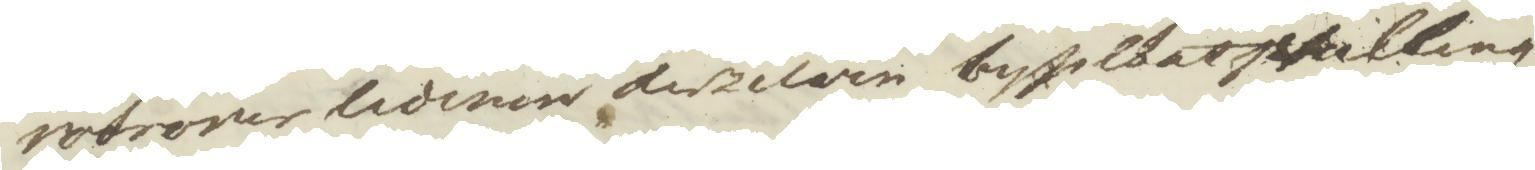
voorover ledenen dezelven byplaatstelling
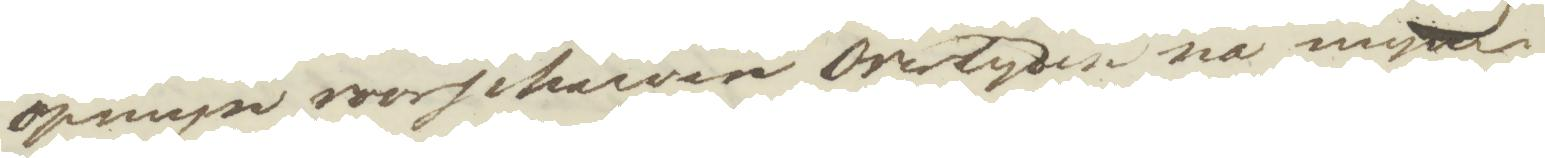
op myn voorschreven overlyden na myn
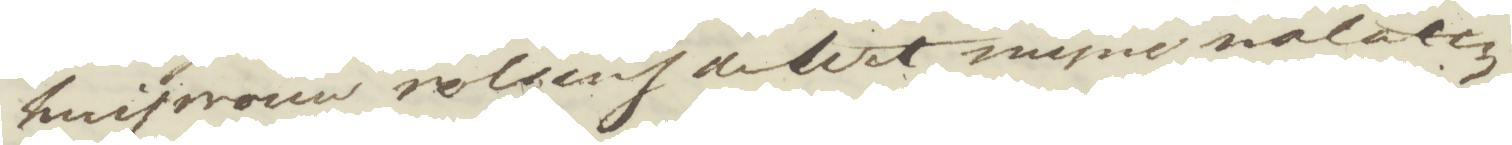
huysvrouw volgens de wet myne nalaten
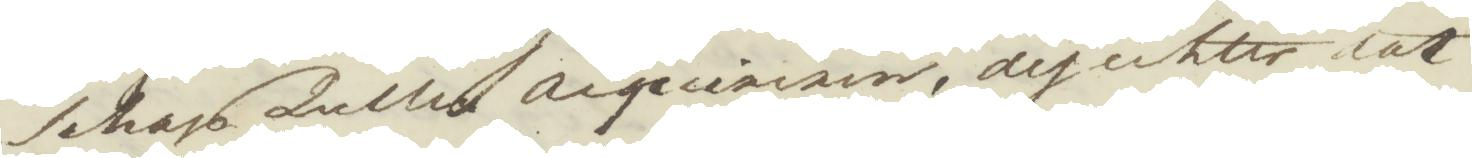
schap zullen acquireren, des echter dat
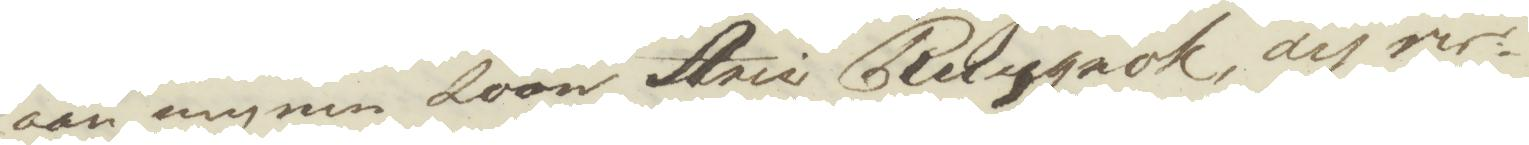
aan mynen zoon Arie Ruygrok, des ver=
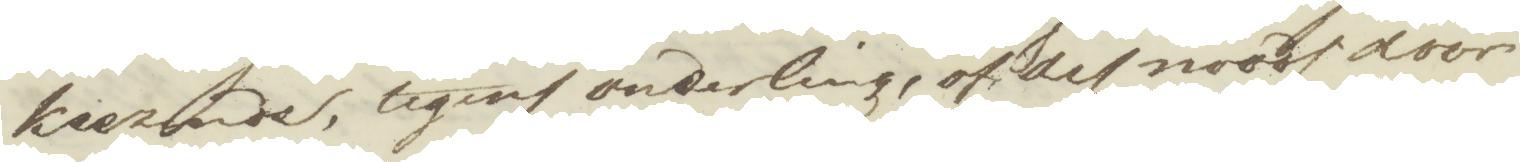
kiezende, tegens onderling, of des noods door
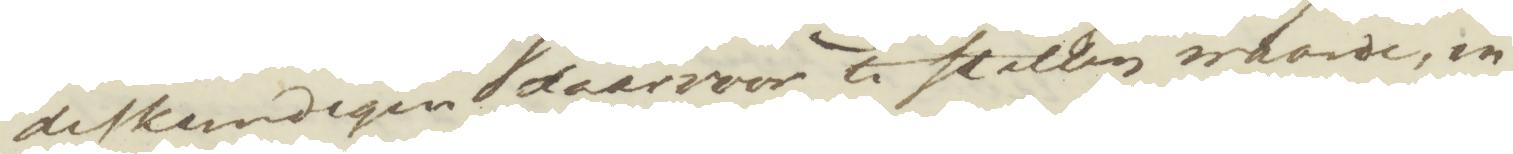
deskundigen daarvoor te stellen waarde, in
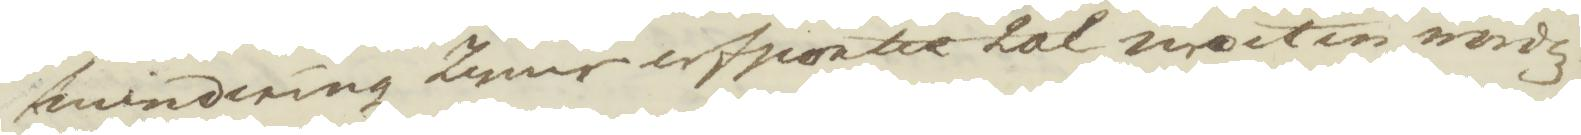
mindering zyner erfportie zal moeten worden
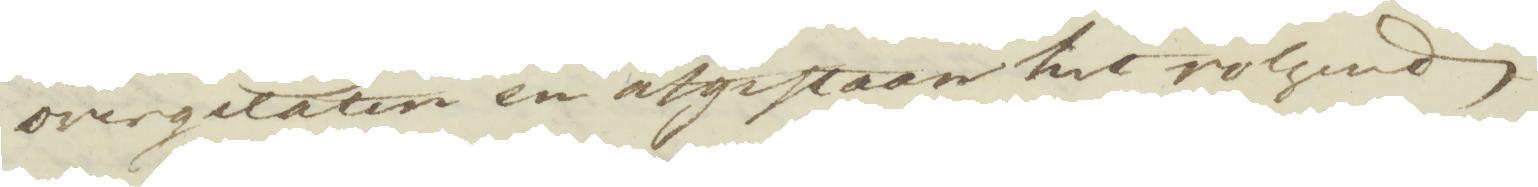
overgelaten en afgestaan het volgend
